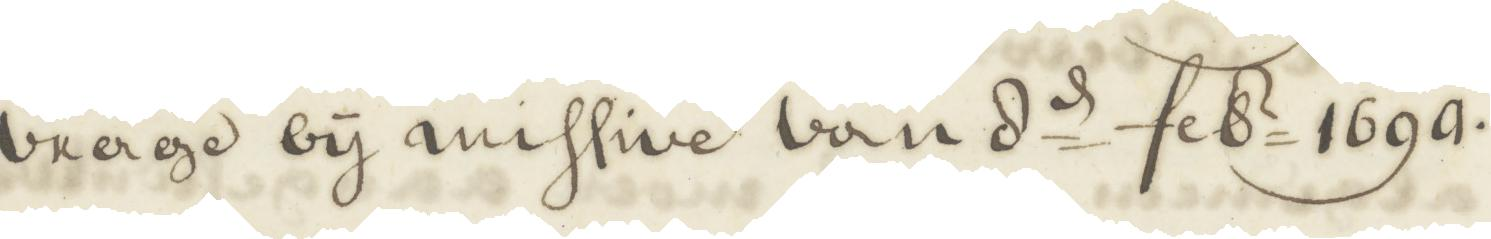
vrage bij missive van 8=en feb= 1694.
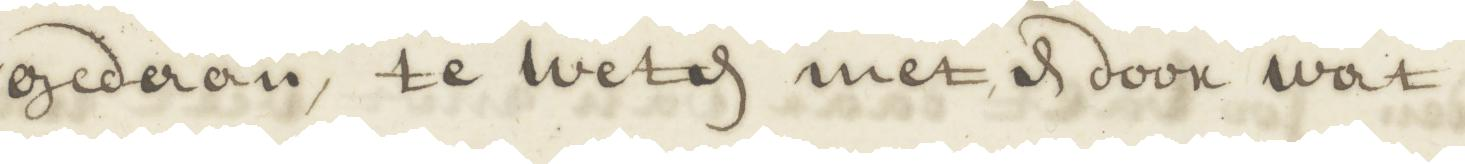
gedaan, te weten met en door wat
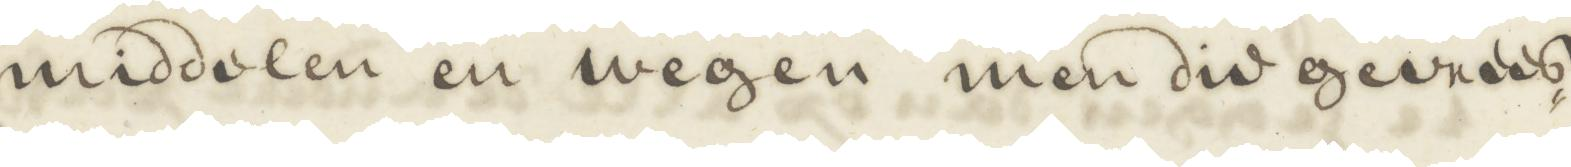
middelen en wegen men die gevrees„
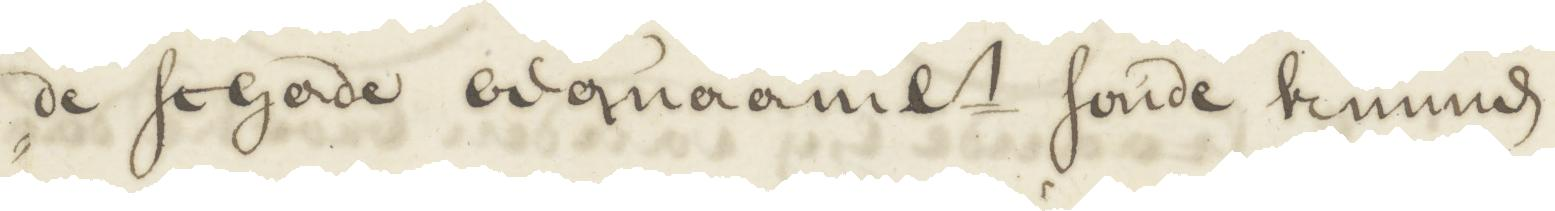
„de schade bequaamlijk soude kunnen
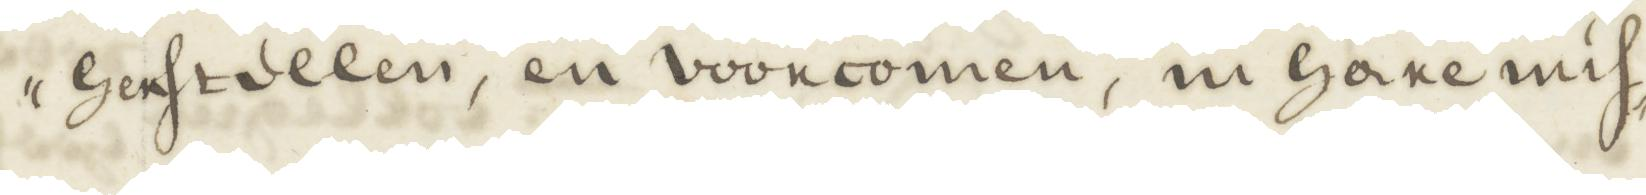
„herstellen, en voorcomen, in hare mis
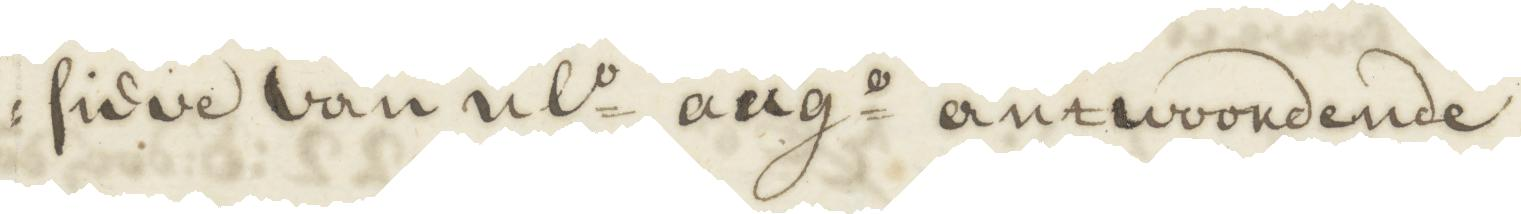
„sieve van ul=o aug=o antwoordende
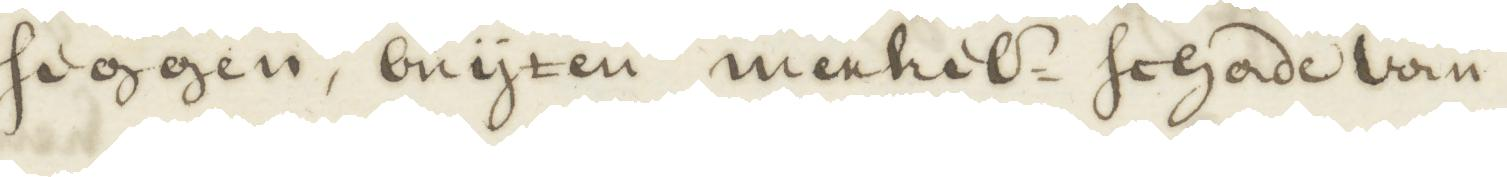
seggen, buijten merkelijk schade van
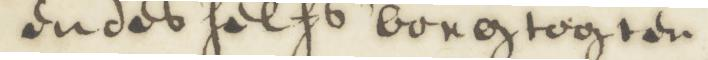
en desselfs borgtogten
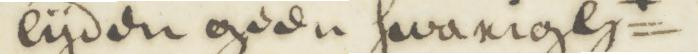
lijden geen swarigh=t
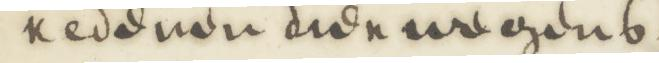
redenen dier wegens
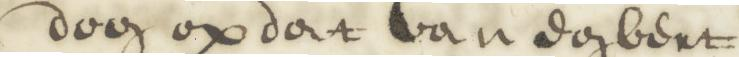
dog op dat van egbert
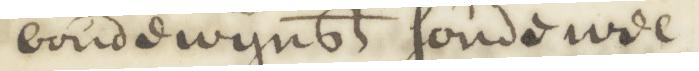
boudewijnst soude wel
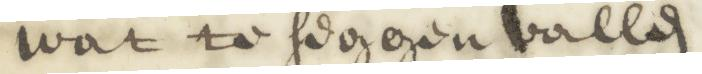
wat te seggen vallen
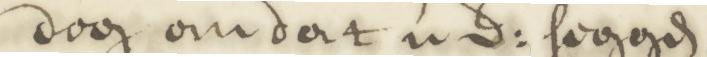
dog om dat u E: seggen
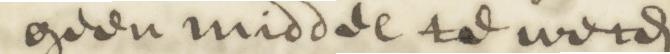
geen middel te weten
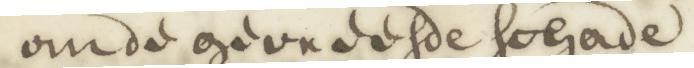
om de gevreesde schade
